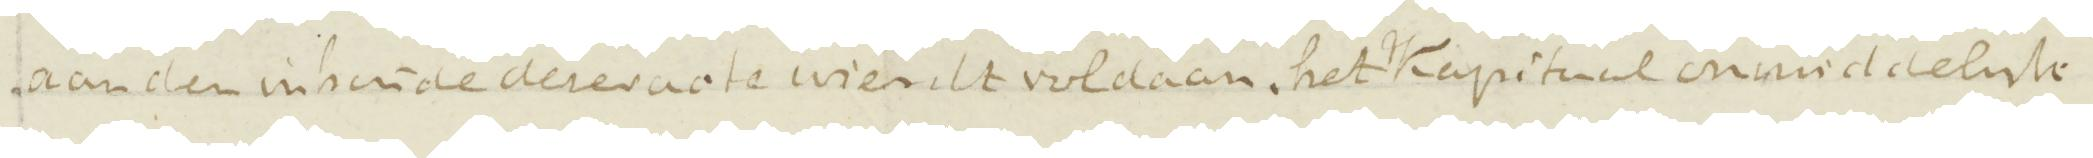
aan den inhoude deser acte wierdt voldaan, het Kapitaal onmiddelyk
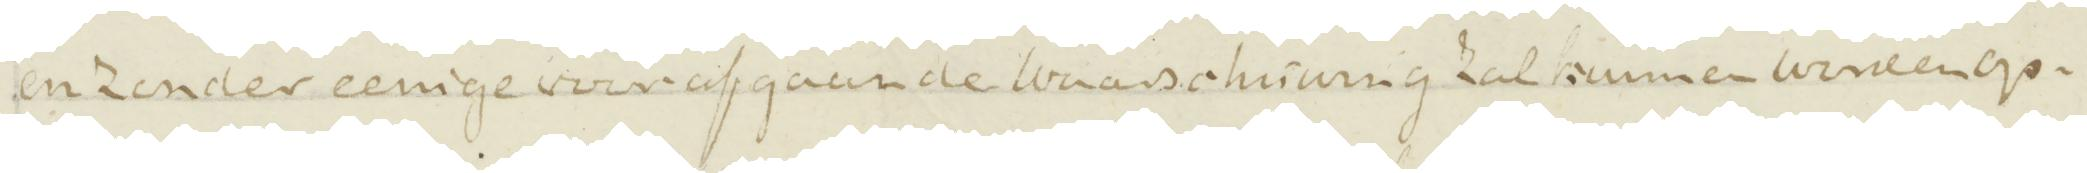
en zonder eenige voor af gaande waarschuwing zal kunnen worden ge-
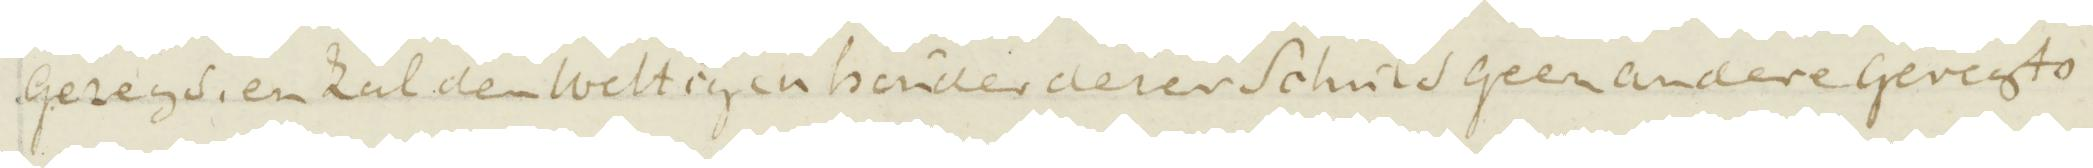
gezegd, en zal den wel tegenhouder dezer schuld geen andere geregto
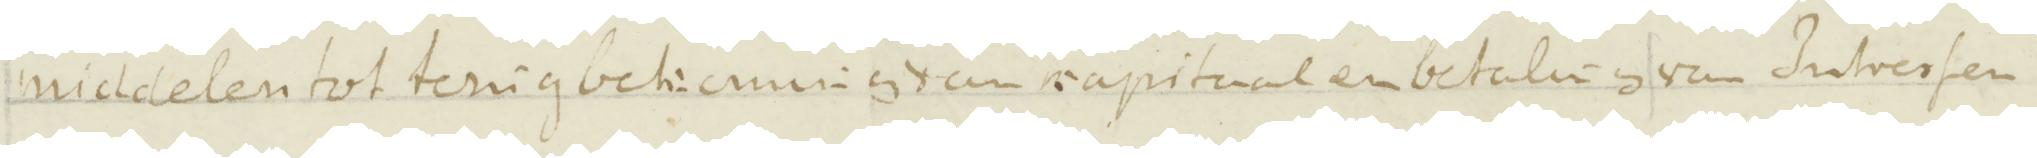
middelen tot terugbekoming van kapitaal en betaling van Intressen
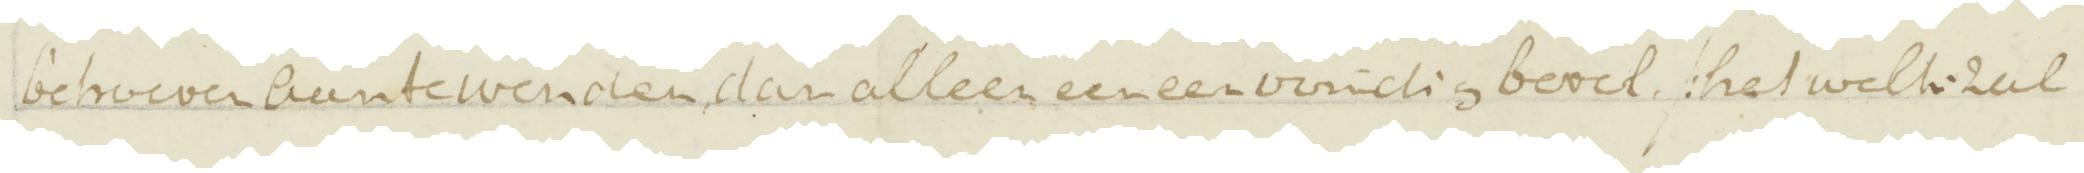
behoeven Aantewenden, dan alleen een eenvoudig bevel, het welke zal
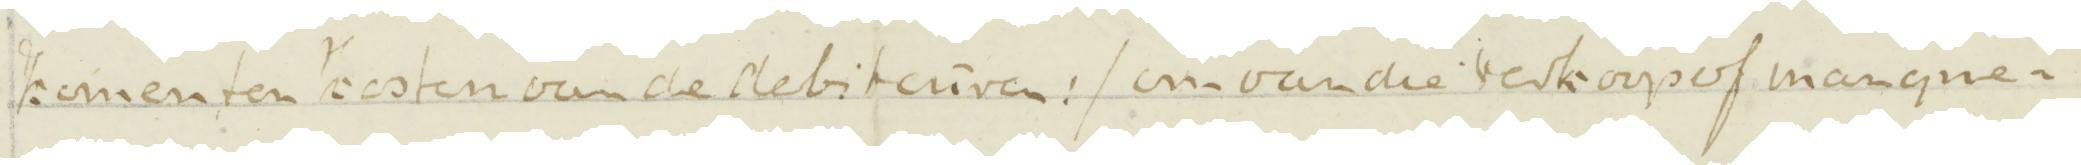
komen ten kosten aan de debiteuren :/om van die Verkoop of manque-
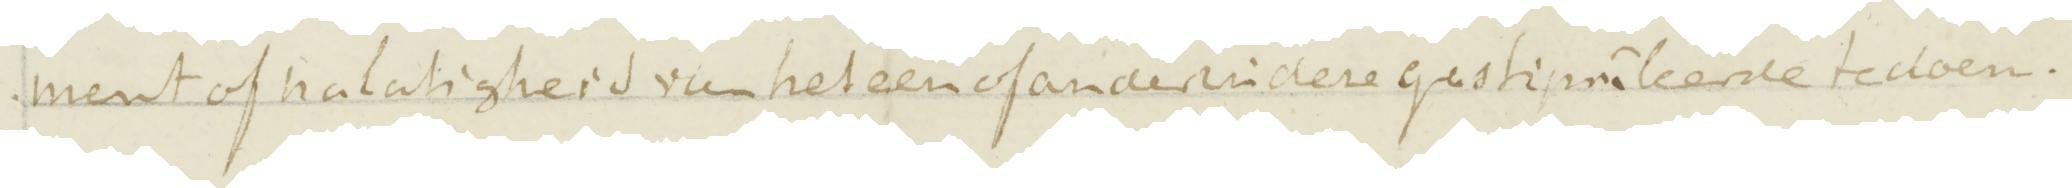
ment of nalatigheid van het een of ander in deze gestimuleerde te doen.
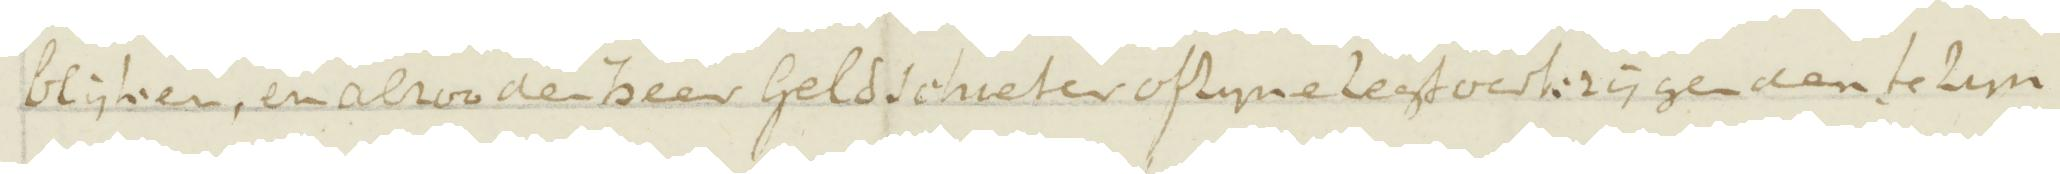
blijken, en alzoo den heer Geldschieter of zyne regt verkrijgen den te zyn
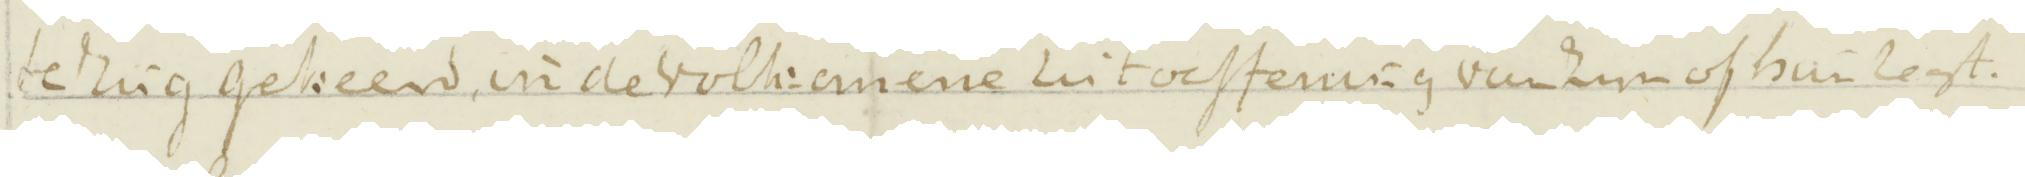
terug gekeerd, in de volkomene uitoeffening van zyn of hun regt.
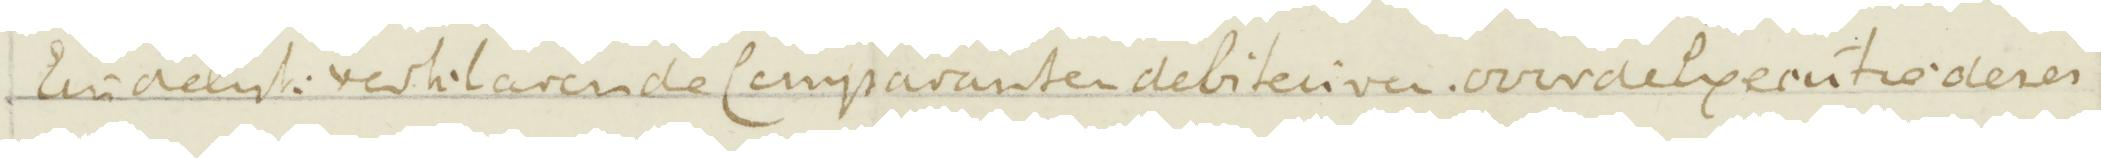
Eindelyk verklarende Comparanten debiteuren voor de Executie dezes
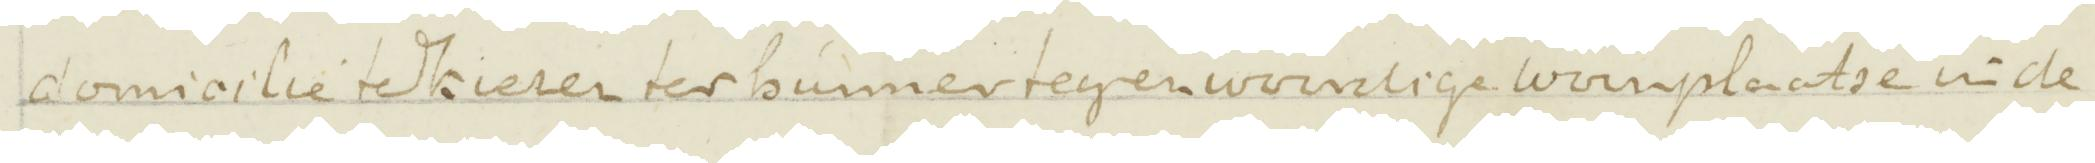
domicilie te kiezen ter hunner tegenwoordige woonplaatze in de
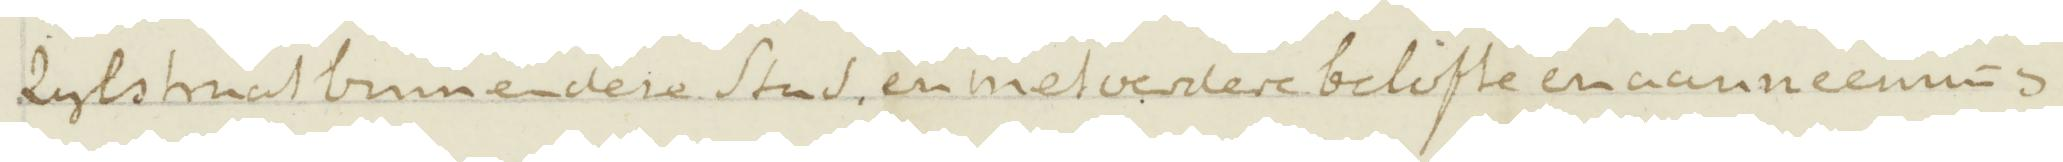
Zylstraat binnen deze stad, en met verdere belofte en aanneeming
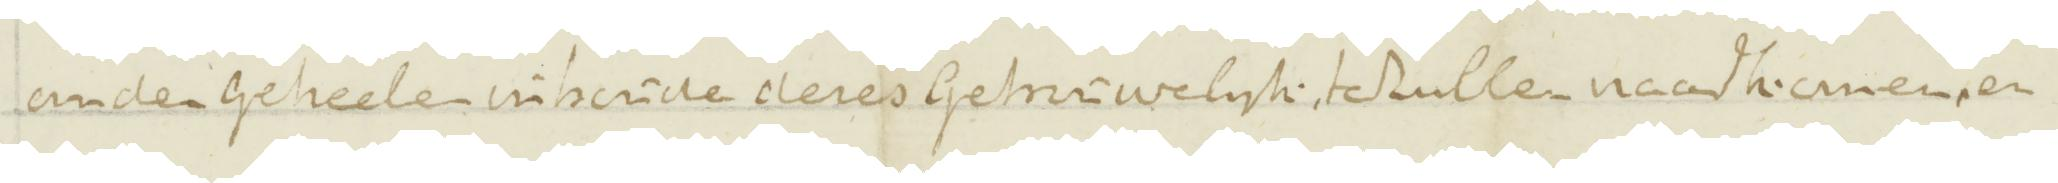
om den geheelen inhoude dezes getrouwelijk, te zullen naakomen, en
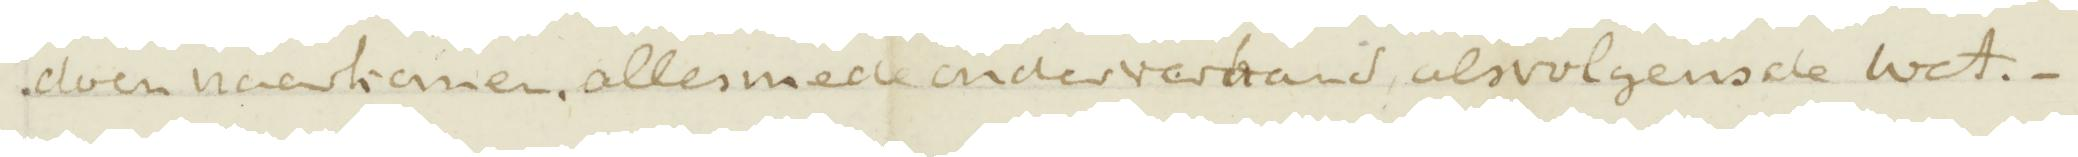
doen voorkomen alles mede onder verhoud, als volgens de wet.-
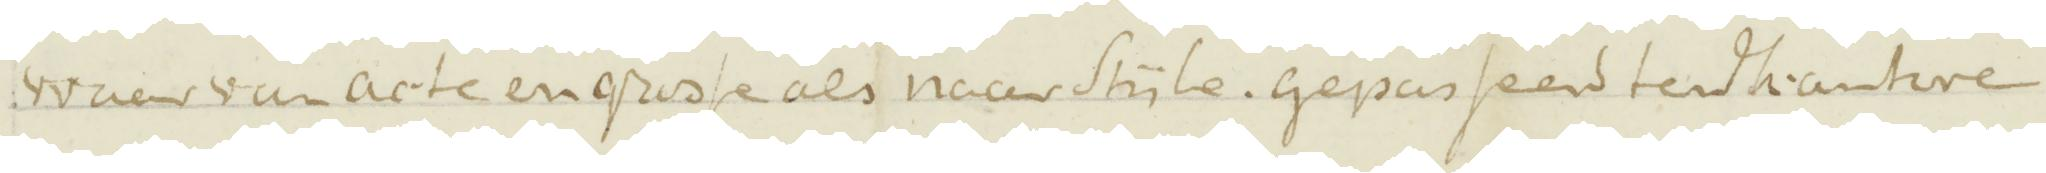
waer van acte en grosse als naar stijle. gepasseerd ten kantore
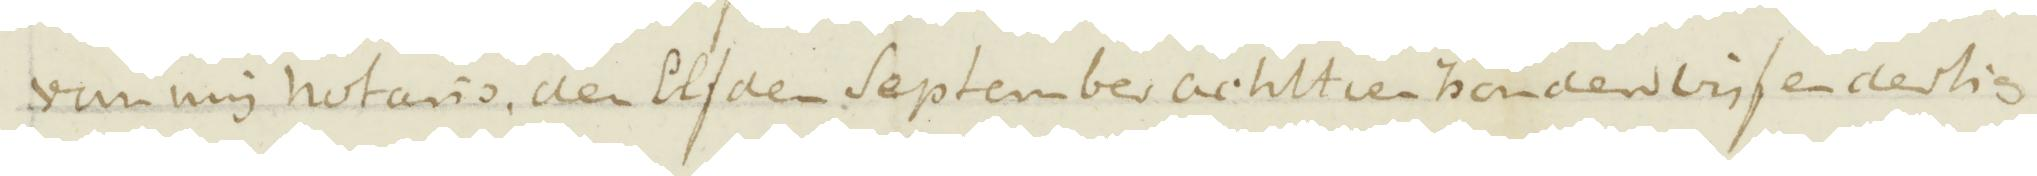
van mij notaris, den Elfden September achttien honderd vijf en dertig
